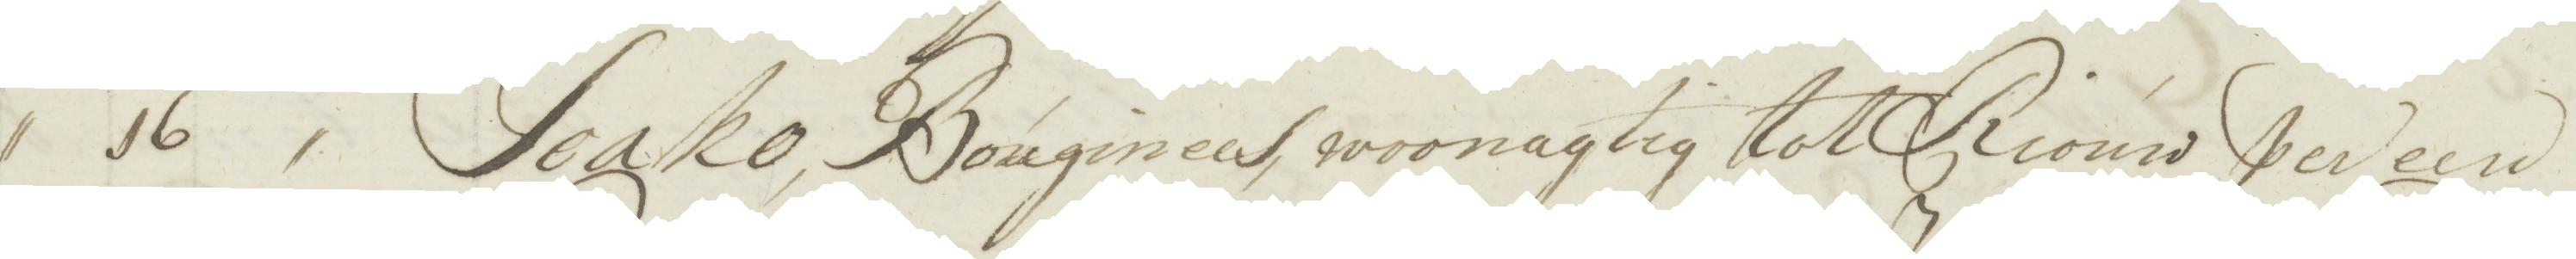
„ 16 „ Teako, Bouginees, woonagtig tot Riouw per een
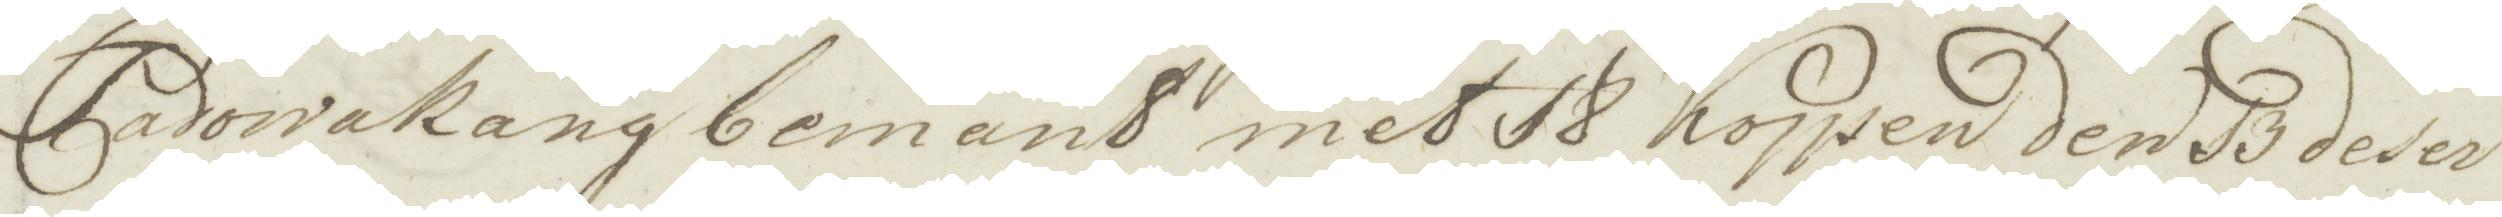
Padowakang bemant met 18 Koppen den 13 deser
